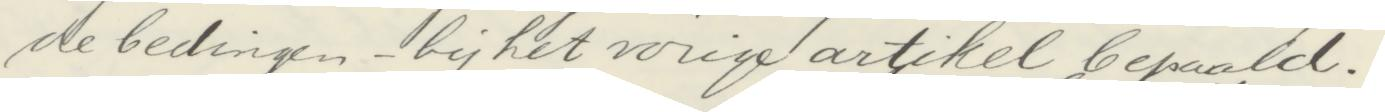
de bedingen bij het vorige artikel bepaald.
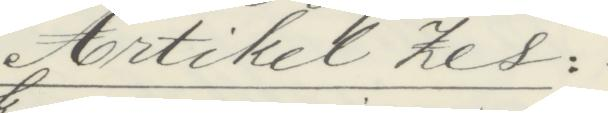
Artikel zes:
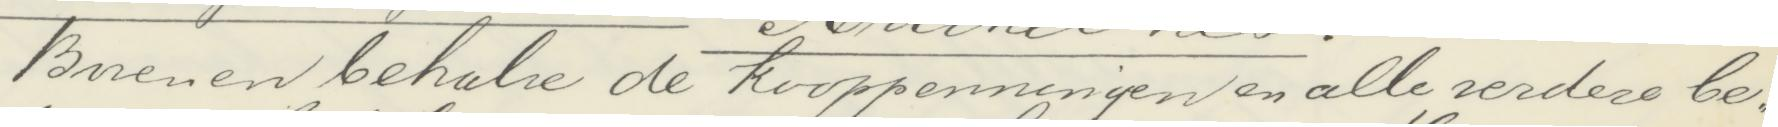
Boven en behalve de kooppenningen en alle verdere be„
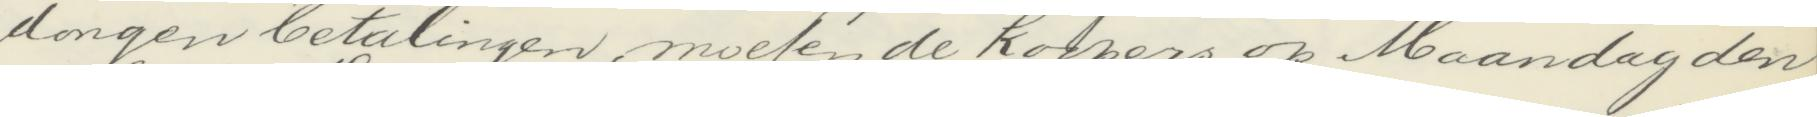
dongen betalingen moeten de koopers op Maandag den
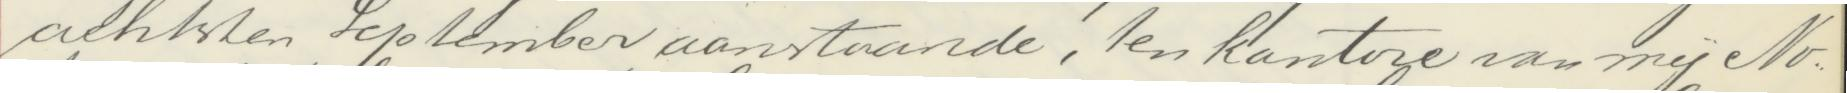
achtsten September aanstaande, ten kantore van mij No„
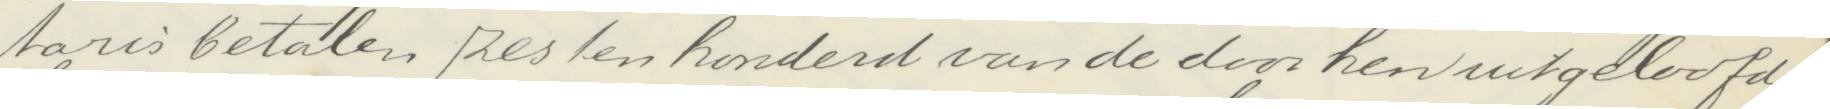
taris betalen zes ten honderd van de door hen uitgeloofde
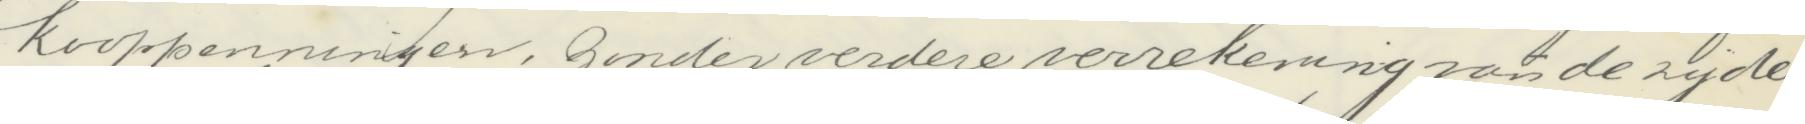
kooppenningen, zonder verdere verrekening van de zijde
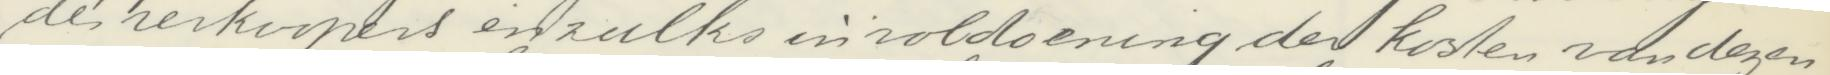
den verkoopers en zulks in voldoening der kosten van dezen
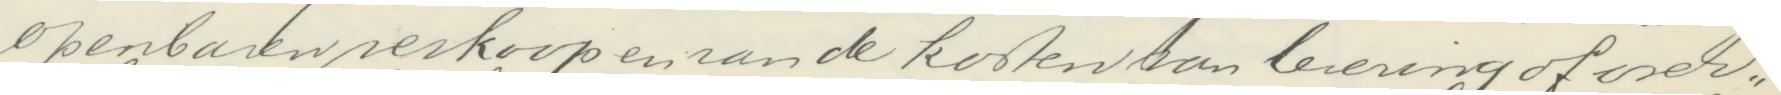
openbaren verkoop en van de kosten van levering of over„
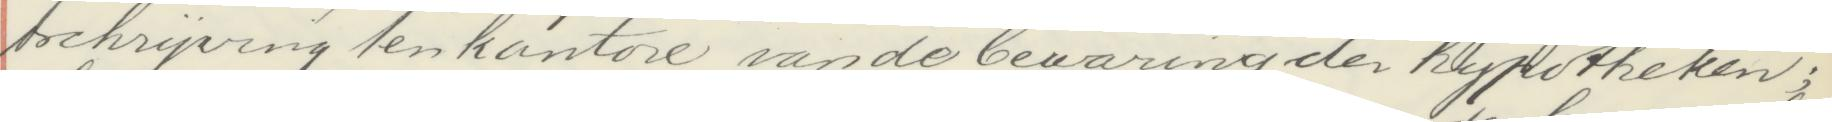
schrijving ten kantore van de bewaring der hypotheken;
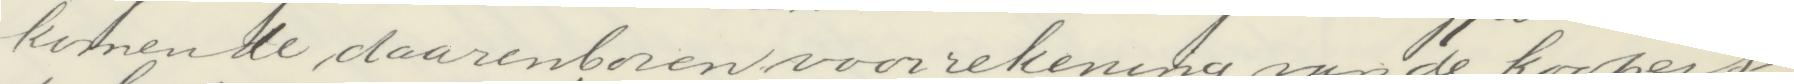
komende, daarenboven voor rekening van de koopers,
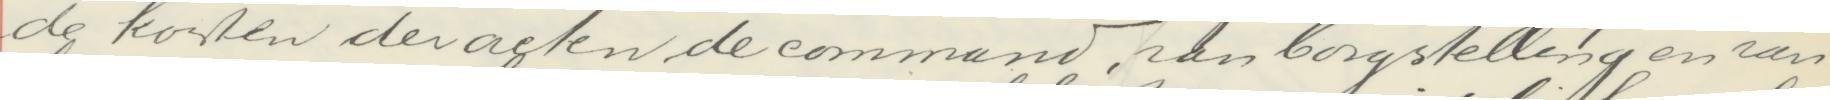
de kosten der acten, de command, van borgstelling en van
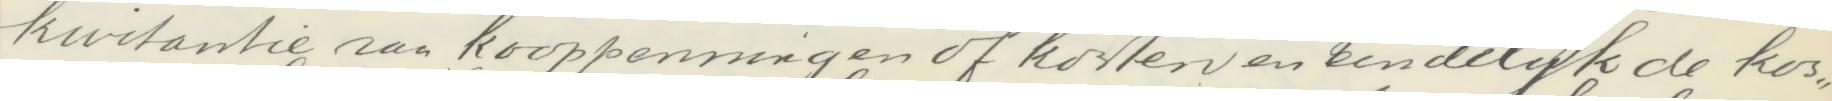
kwitantie van kooppenningen of kosten en eindelijk de kos„
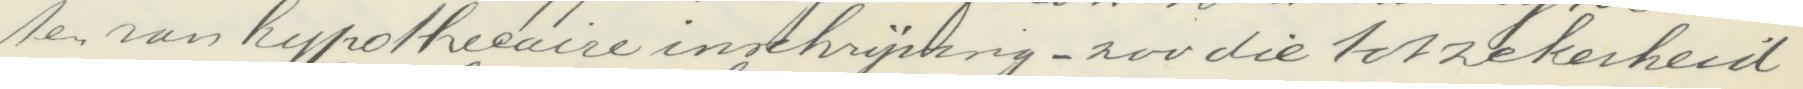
ten van hypothecaire inschrijving - zoo die tot zekerheid
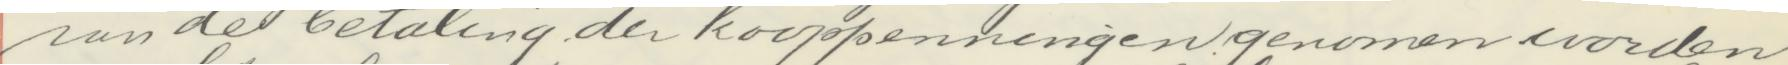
van de betaling, der kooppenningen genomen worden
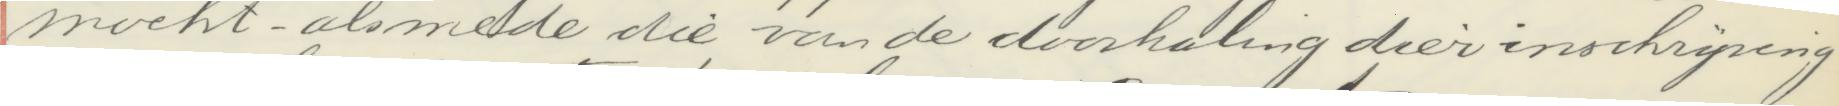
mocht- alsmede die van de doorhaling dier inschrijving
